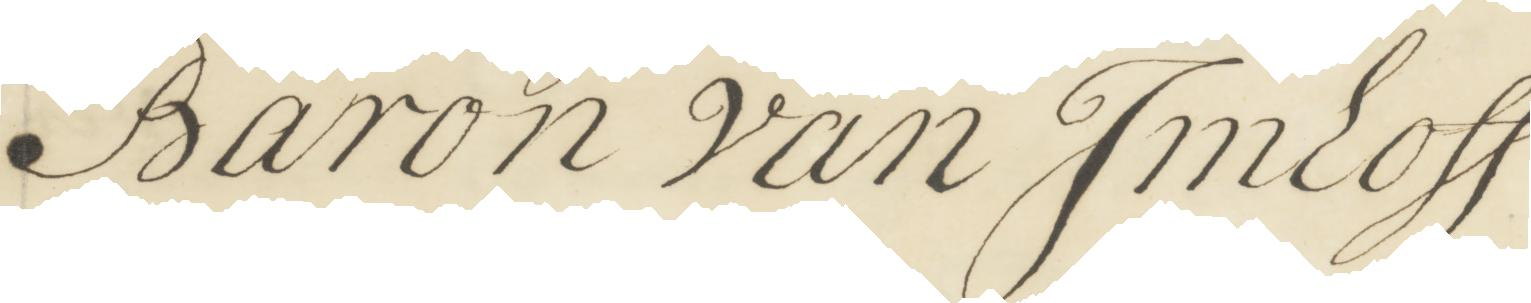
Baron van Jmhoff
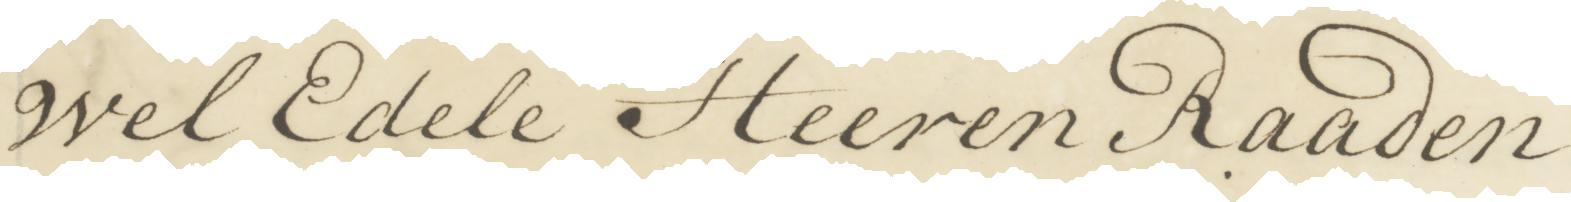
wel Edele Heeren Raaden
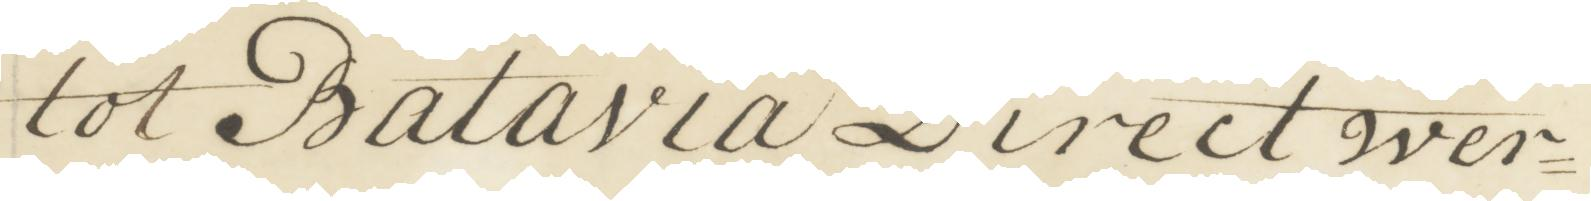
tot Batavia Direct wer=
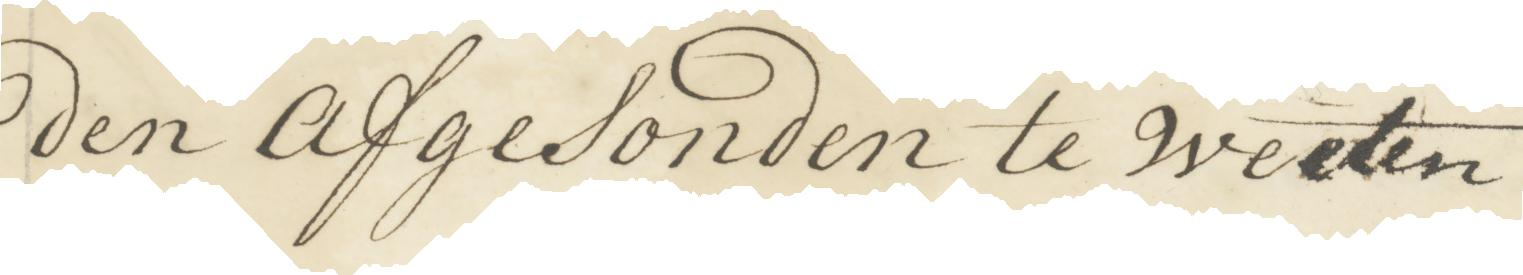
den afgesonden te weeten
